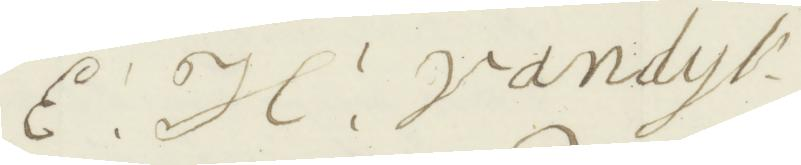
E: H: Van dyk
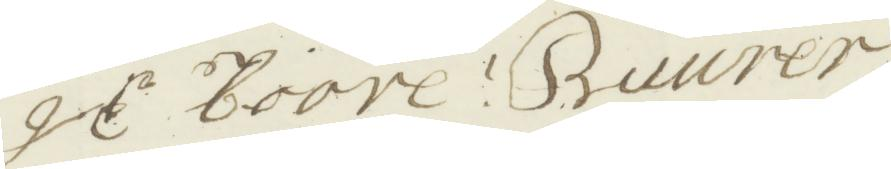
geboore: Buurer
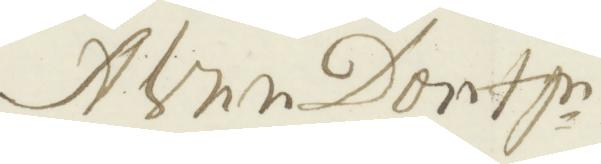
A: Van Dort j„r
